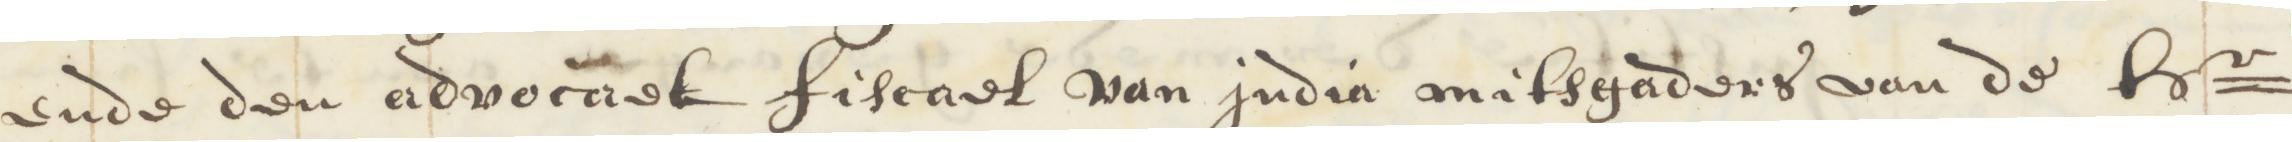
ende den advocaet fiscael van jndia mitsgaders van de H=r
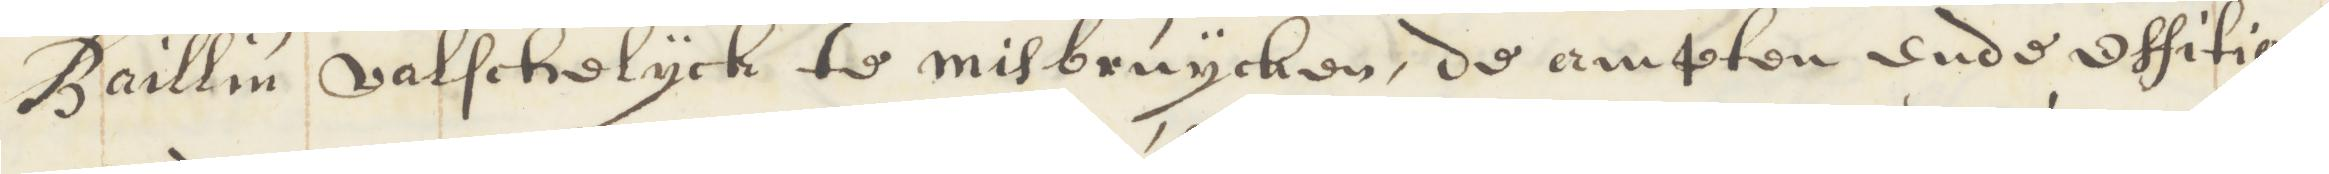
Bailliu valschelijck te misbruijcken, de ampten ende offitien
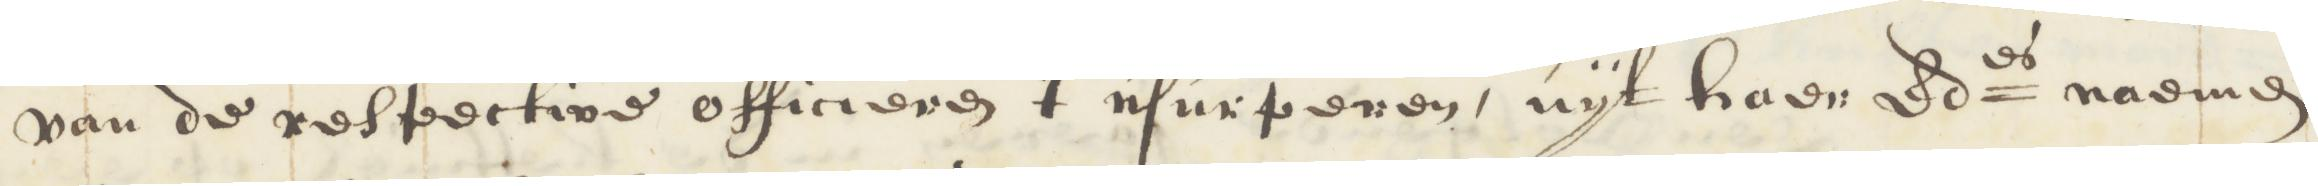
van de respective officieren ’t usurperen, uijt haer Ed=es naemen
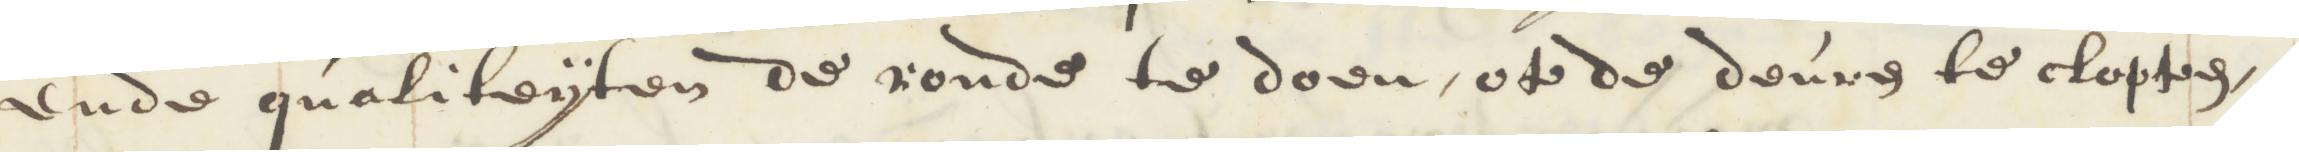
Ende qualiteijten de ronde te doen, op de deuren te clopten,
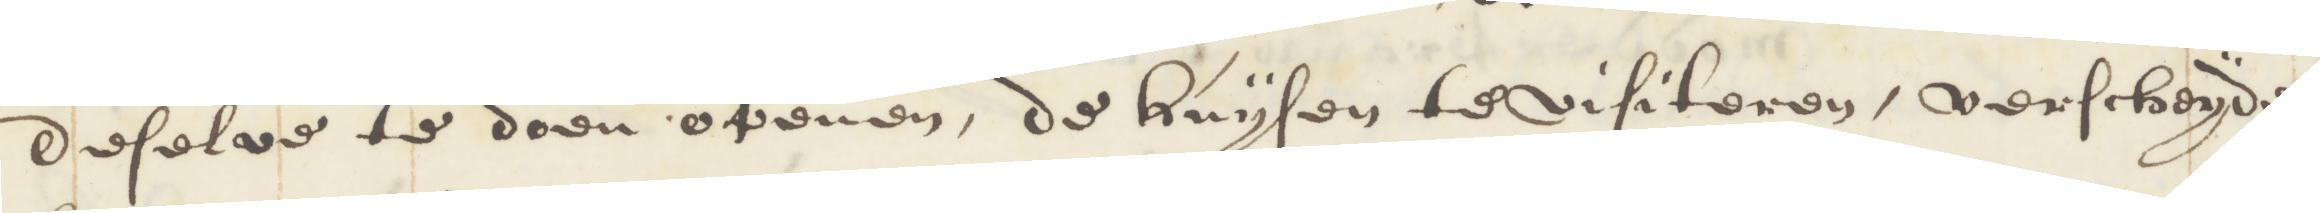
deselve te doen openen, de huijsen te visiteren, verscheijde
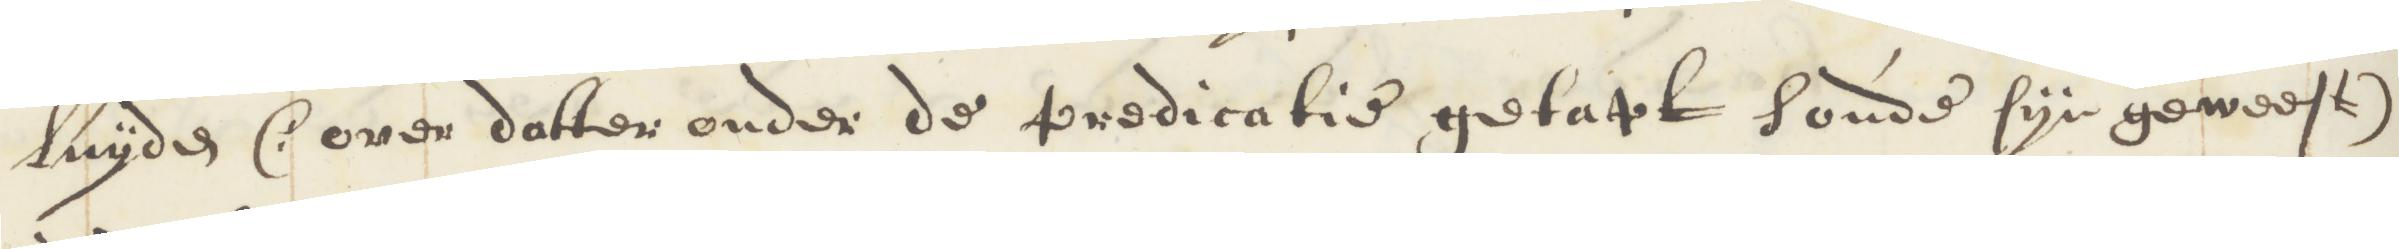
luijden (:over datter onder de predicatie getapt soude sijn geweest)
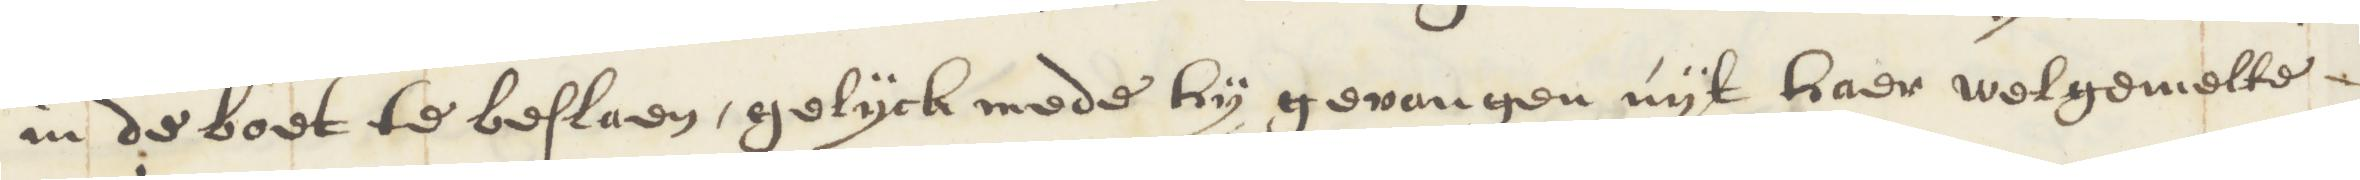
in de boet te beslaen, gelijck mede hij gevangen uijt haer welgemelte —
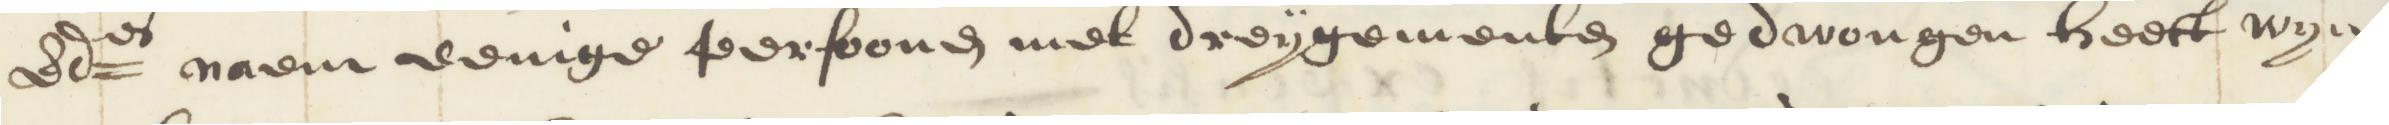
Ed=es naem eenige persoonen met dreijgementen gedwongen heeft wijn
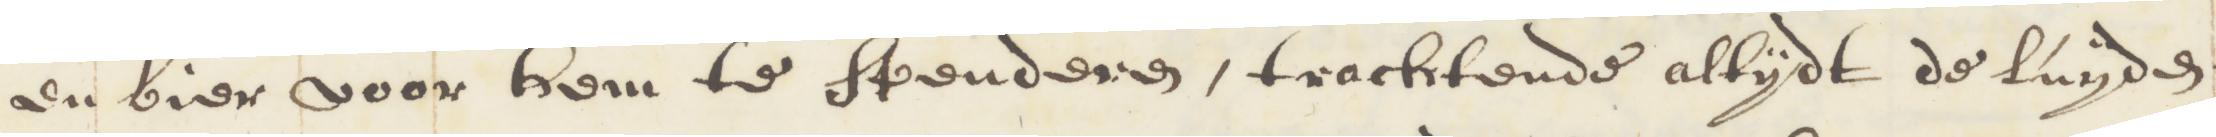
en bier voor hem te spenderen, trachtende altijdt de luijden
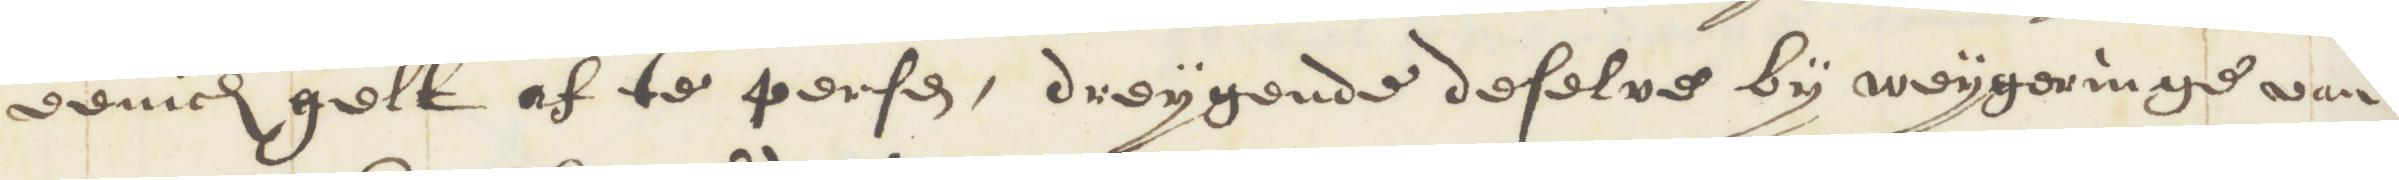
eenich gelt af te persen, dreijgende deselve bij weijgeringe van
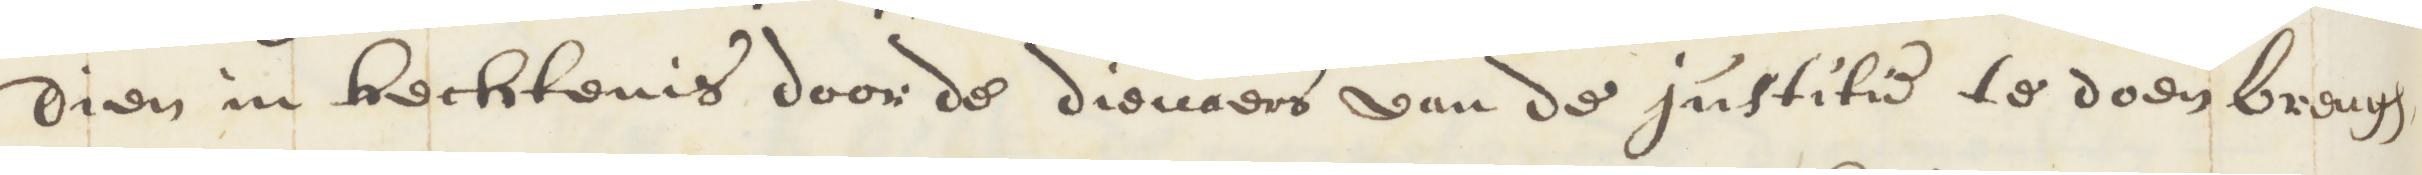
dien in hechtenis door de dienaers van de justitie te doen brengen,
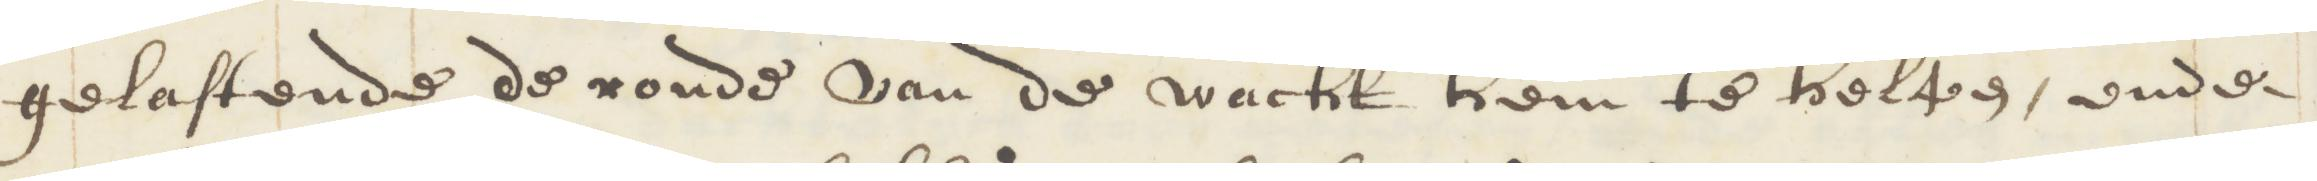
gelastende de ronde van de wacht hem te helpen, ende —
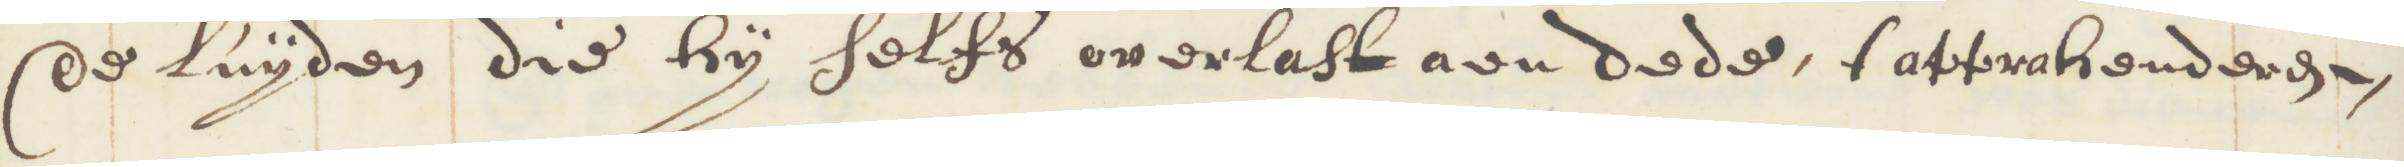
de luijden die hij selfs overlast aen dede, t apprahenderen —,
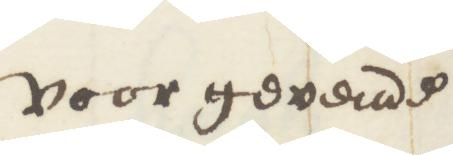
voor gevende
